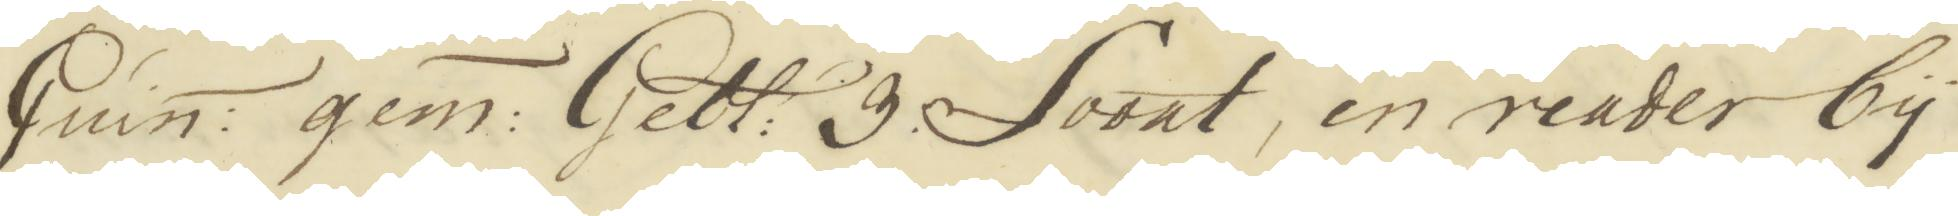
Guin: gem: Gebl: 3. Soort, en verder bij
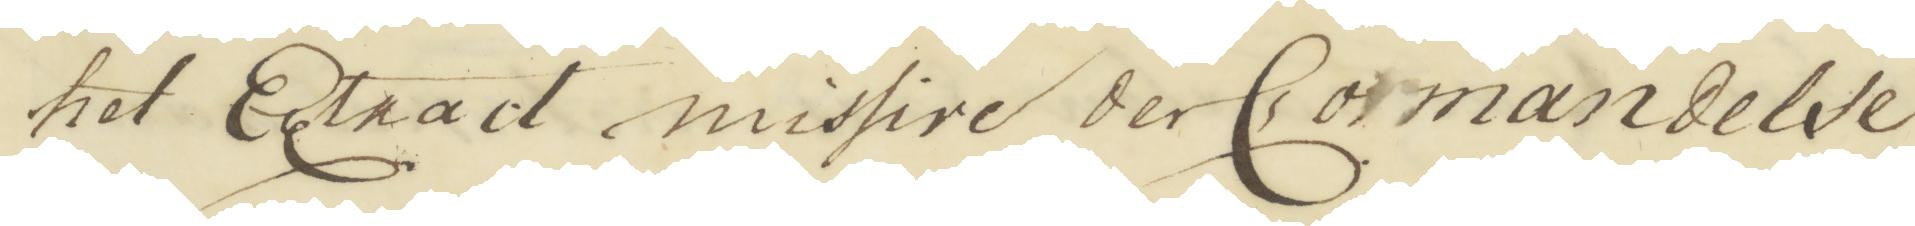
het Extract missive der Cormandelse
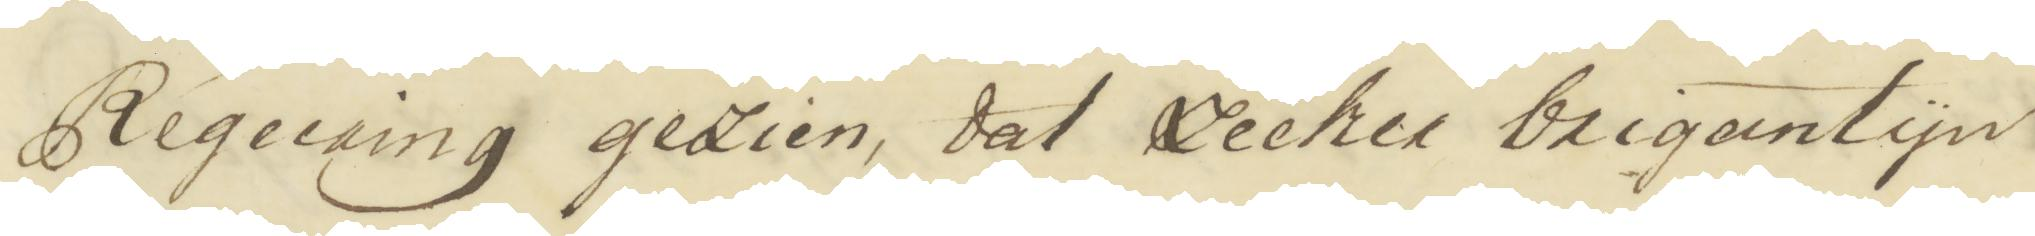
Regeering gezien, dat zeeker brigantijn
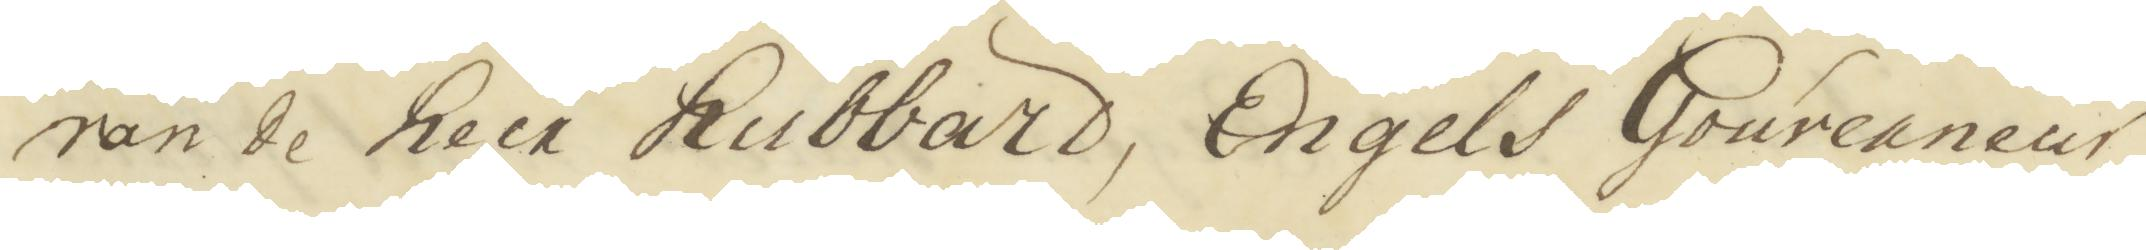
van de heer hubbard, Engels Gouverneur
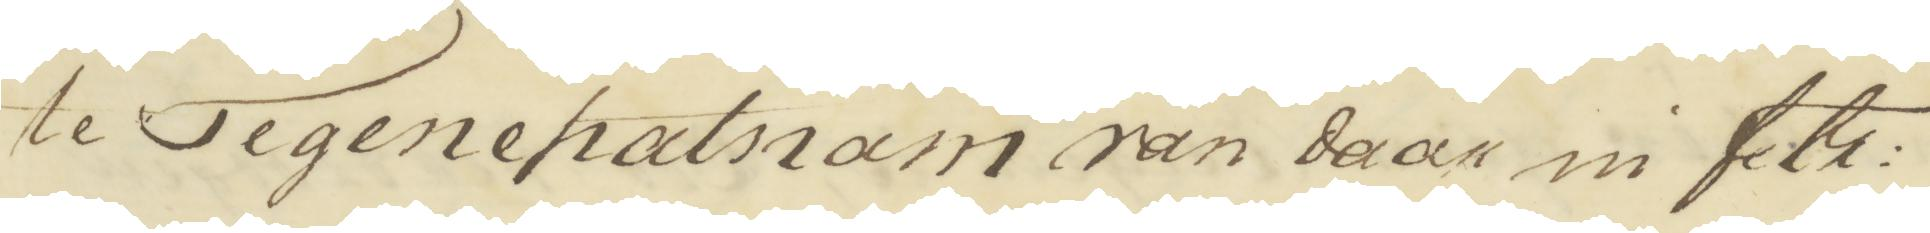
te Tegenepatnam van daar in febr:
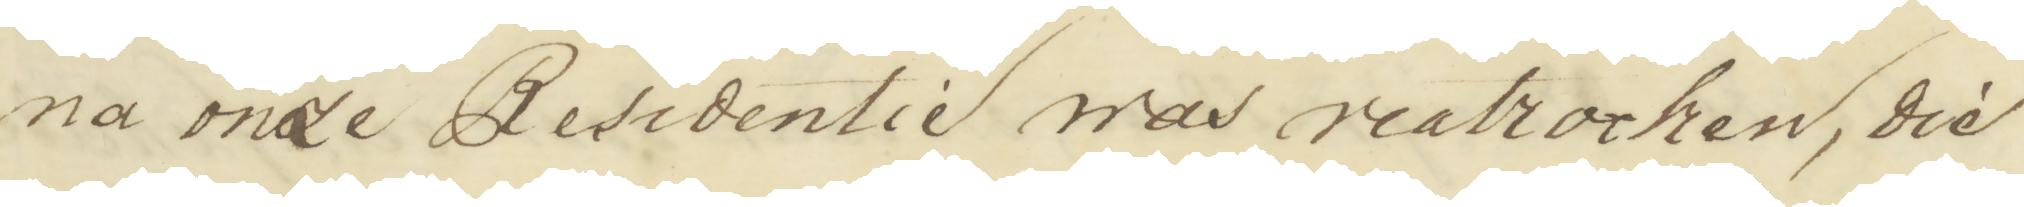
na onze Residentie was vertrocken, die
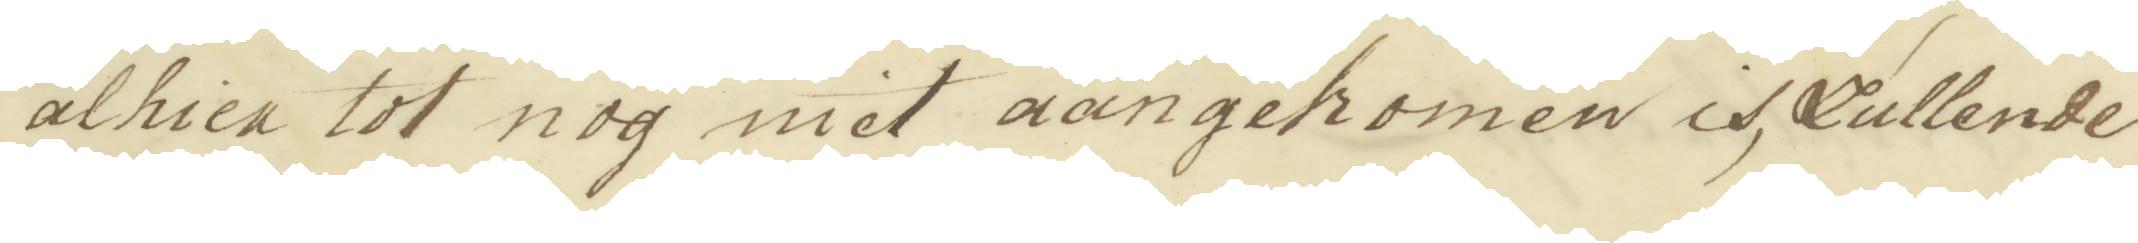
alhier tot nog niet aangekomen is, Zullende
